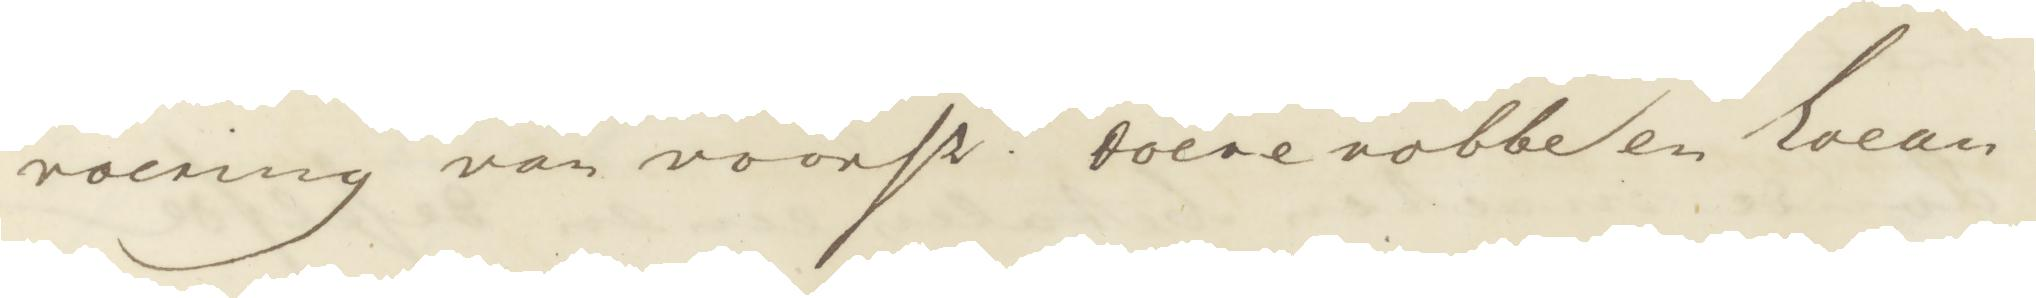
voering van voorsz: doere robbe en Hoean
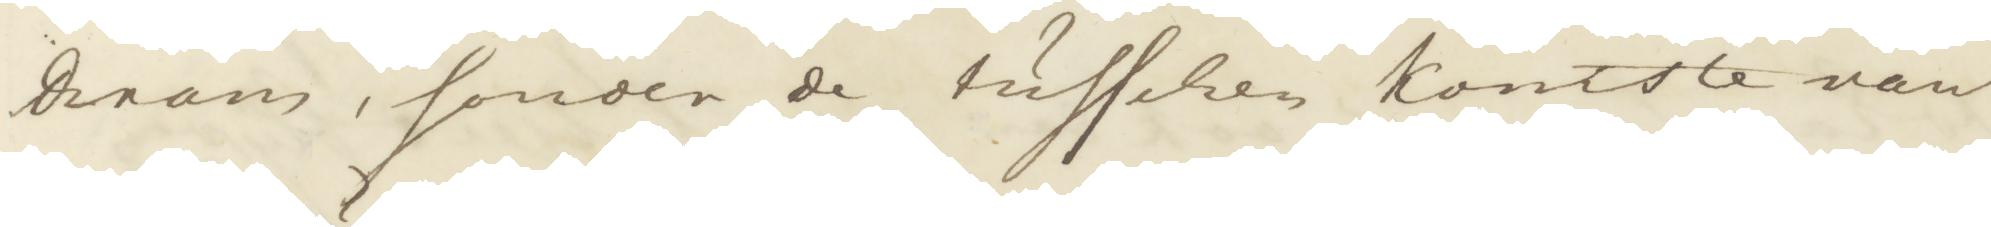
dram, sonder de tusschen komste van
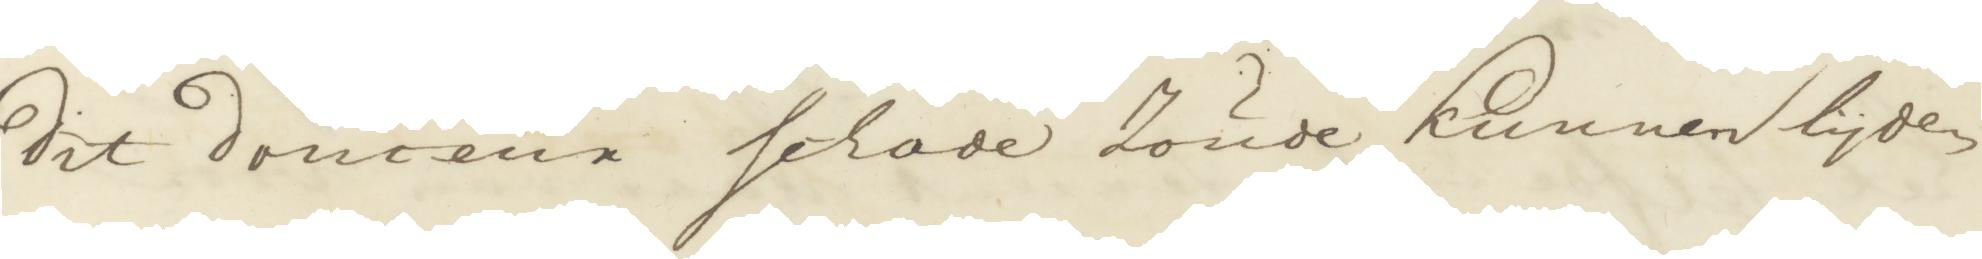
dit douceur schade zoude kunnen lijden
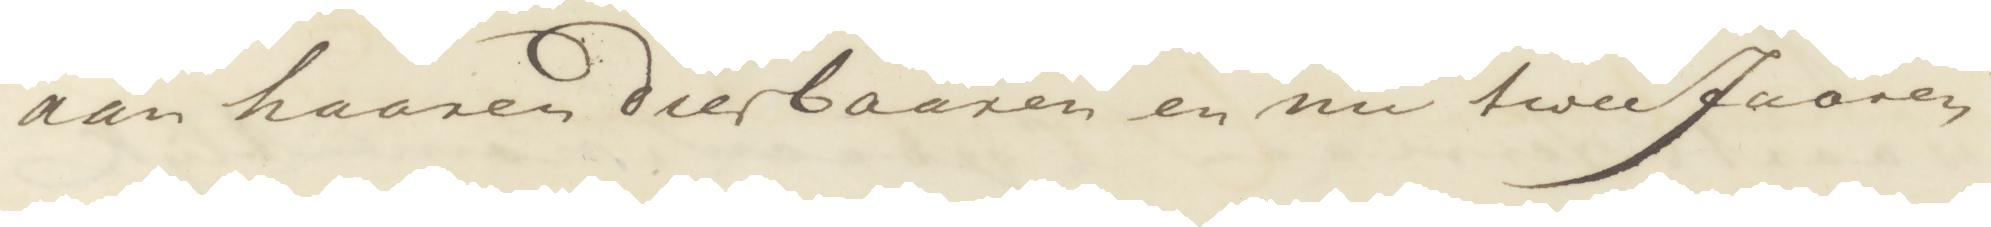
aan haaren dierbaaren en nu twee Jaaren
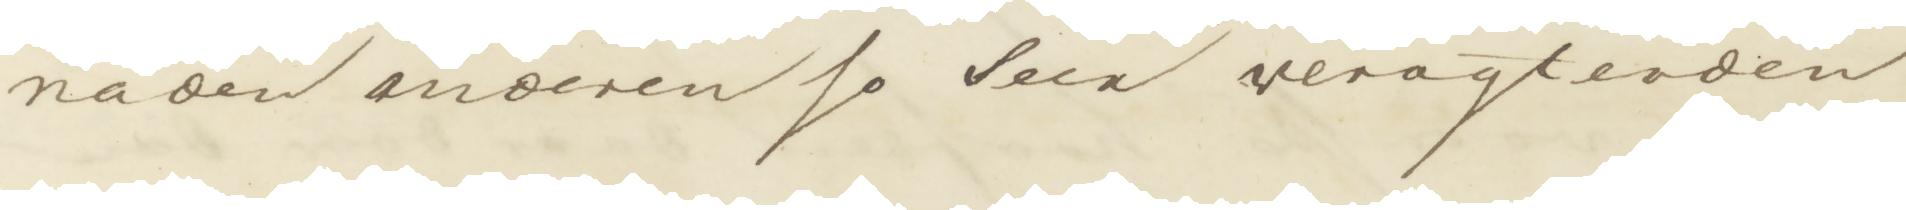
na den anderen so seer veragterden
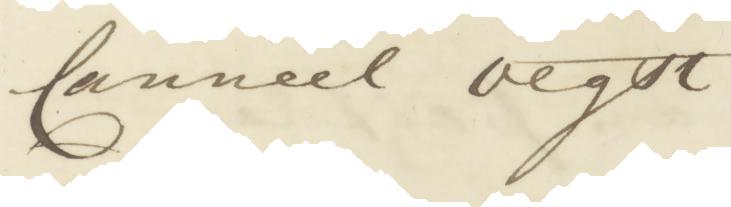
Canneel oegst
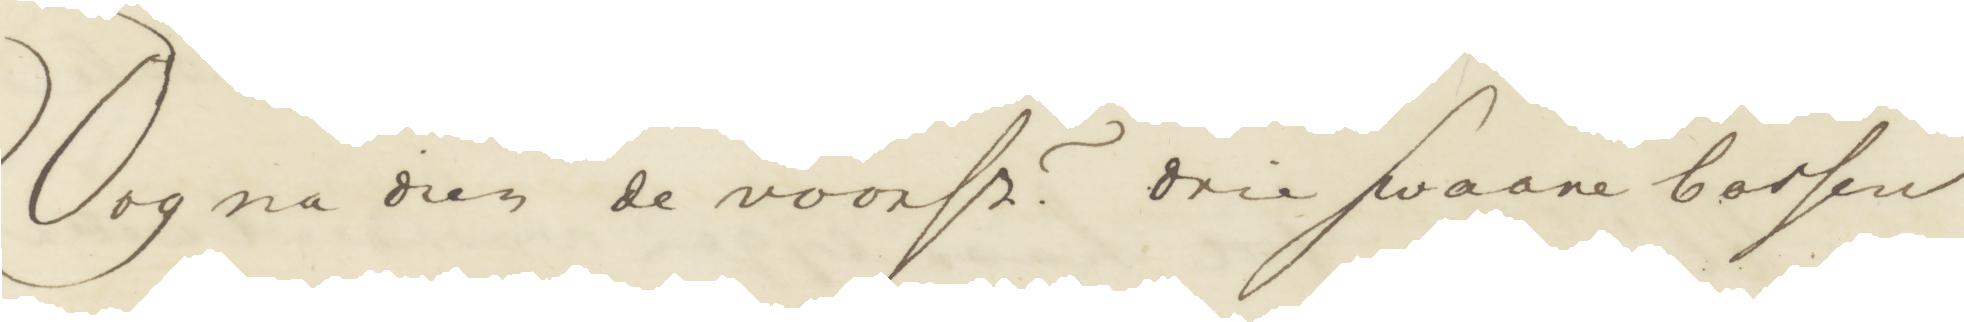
Dog na dien de voorsz. drie swaare bossen
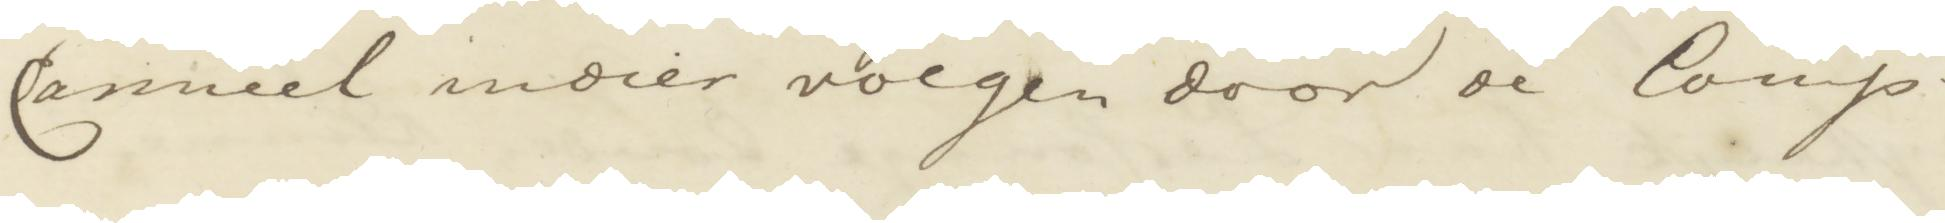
Canneel indier voegen door de Comp.
